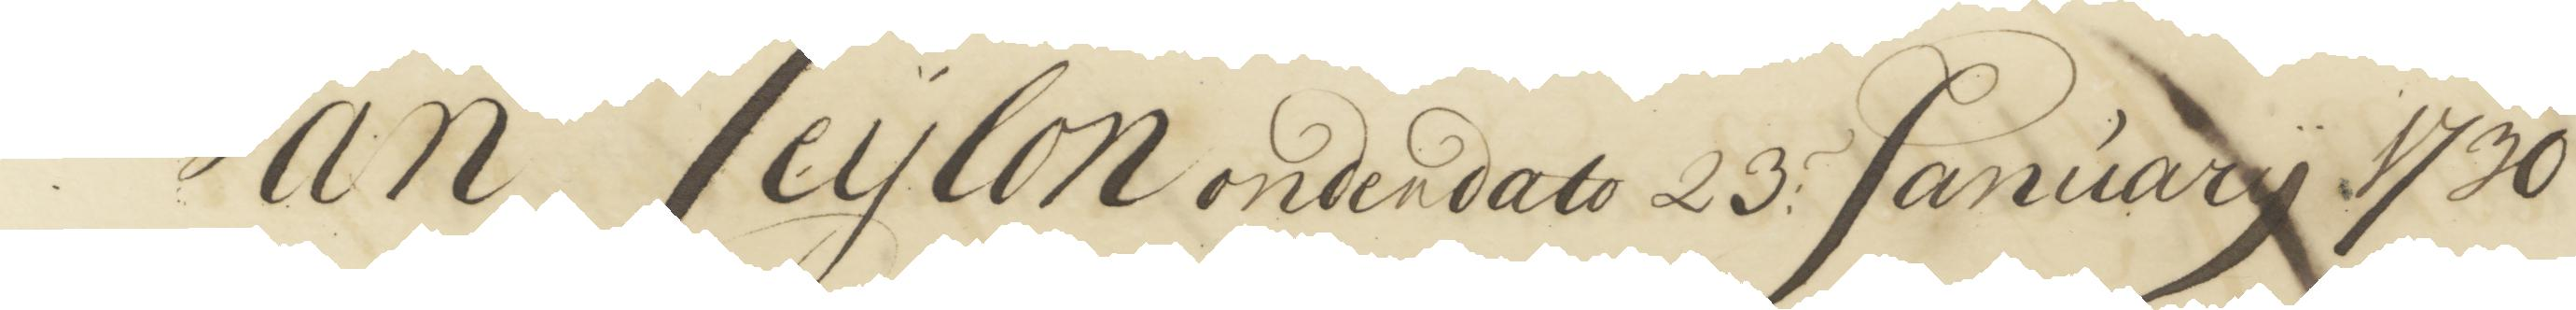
Van Ceijlon onder dato 23:' Januarij 1730
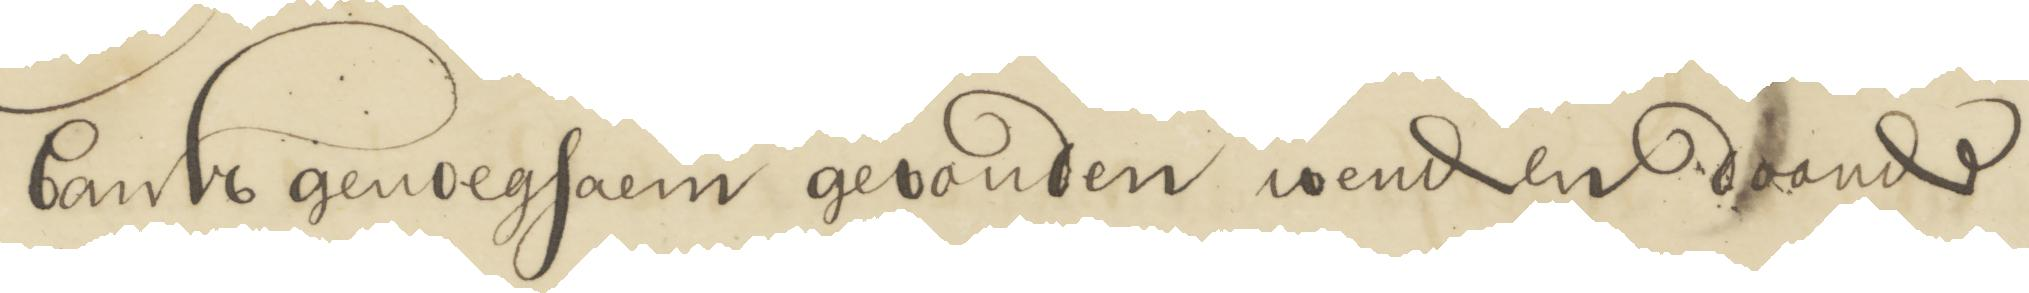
bank genoegsaem gevonden werden doorde
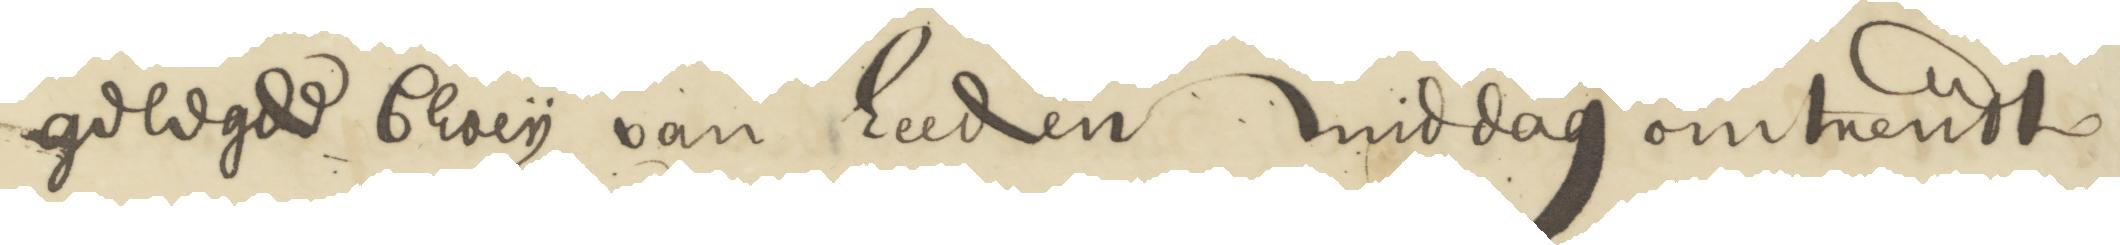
gelegde bhoeij van heeden middag omtrendt
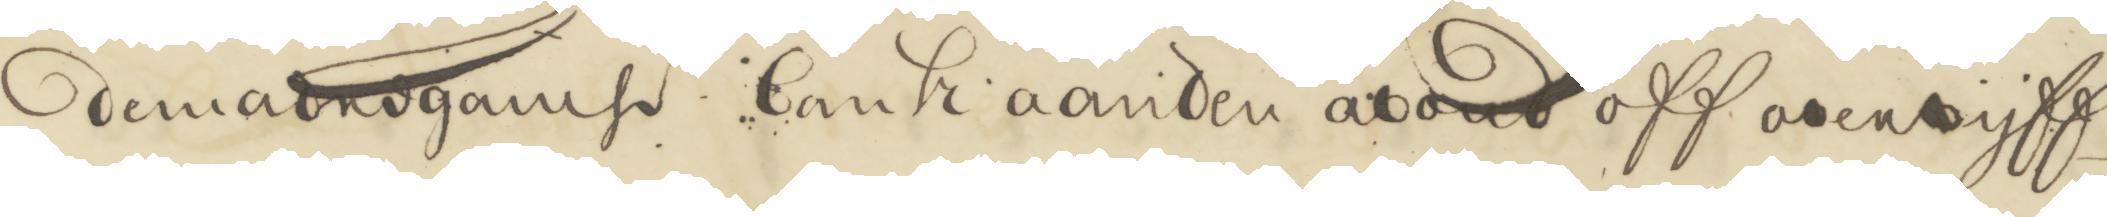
de madregamse bank aan den avond off overvijff
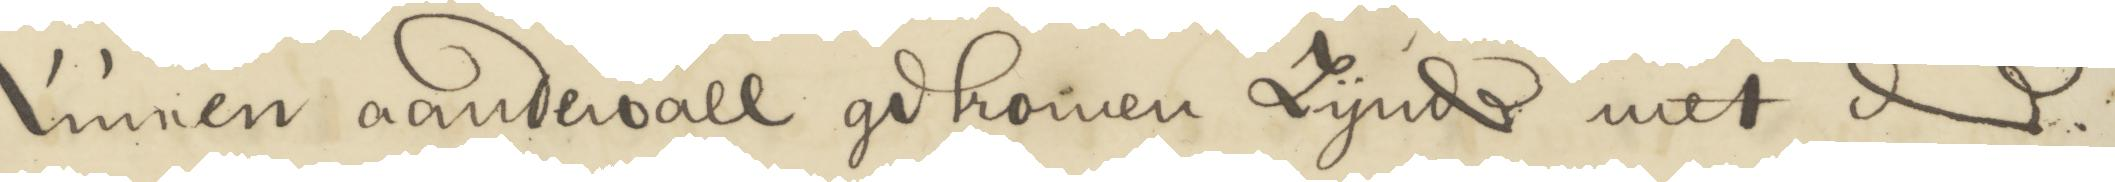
uuren aan dewall gekomen Zijnde met de.
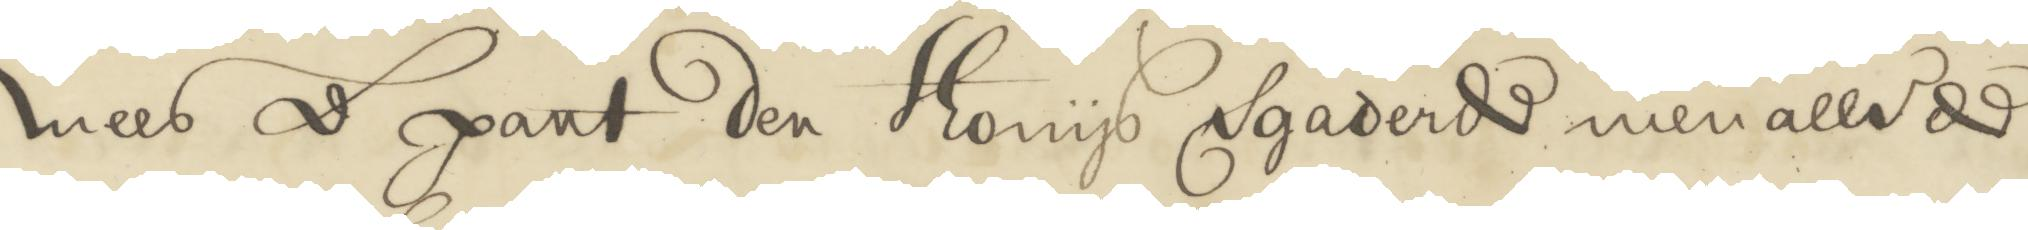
meeste part der thonijs vergaderde men alle de
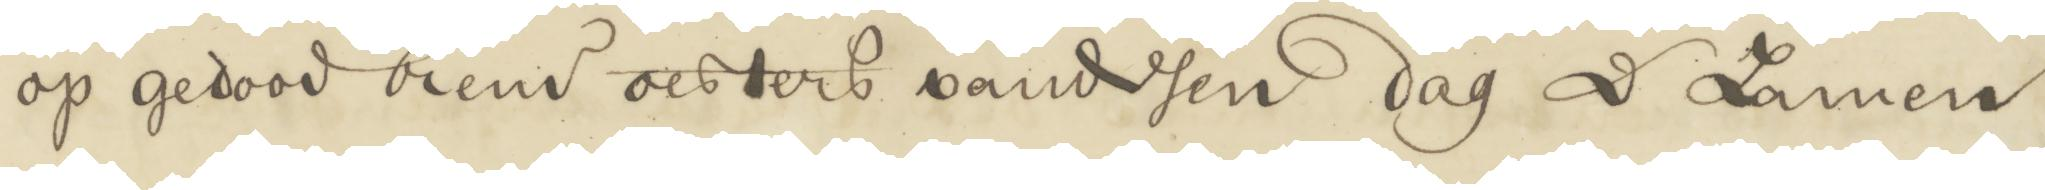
op gedooekene oesters vandesen dag te Zamen
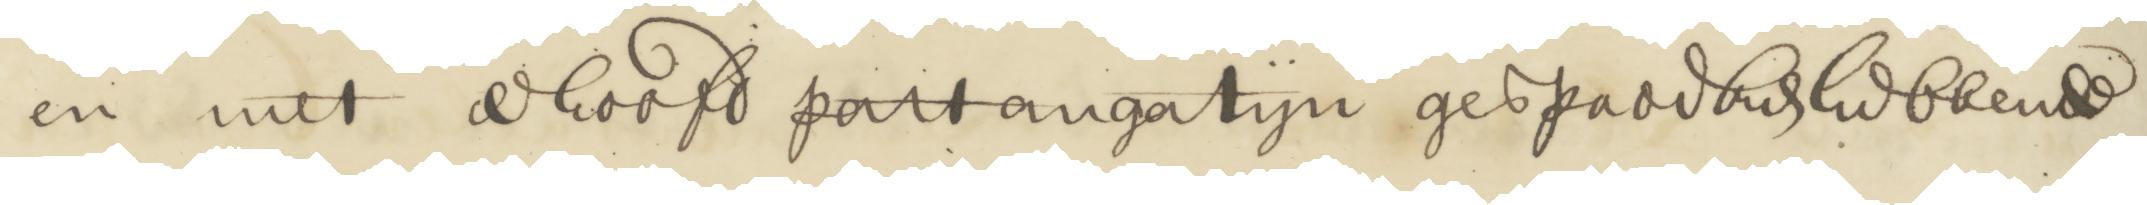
en met de hoofd pattangatijn gesproeken hebbende
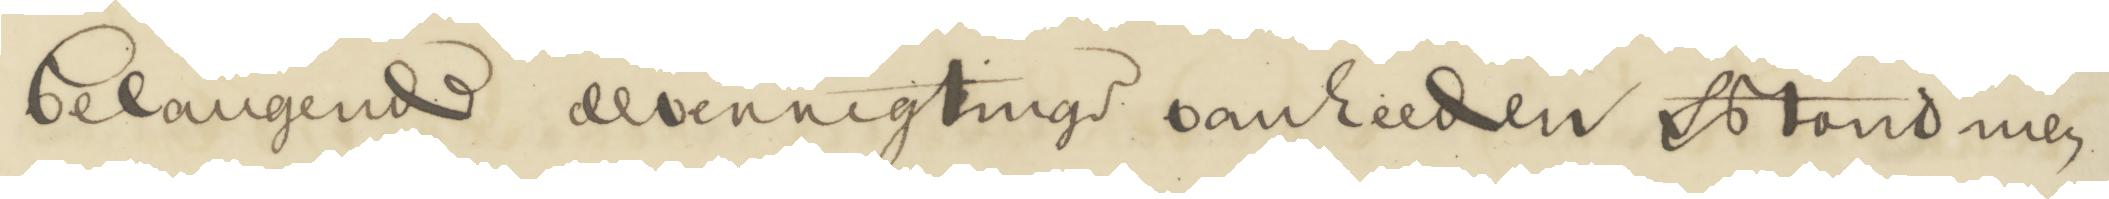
belangende de verrigtinge vanheeden verstond men
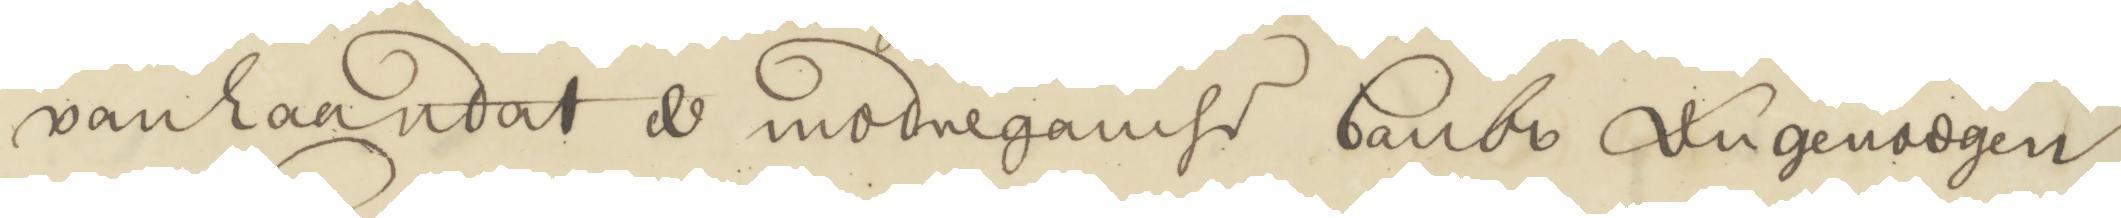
van haar dat de modregamse bank ten genoegen
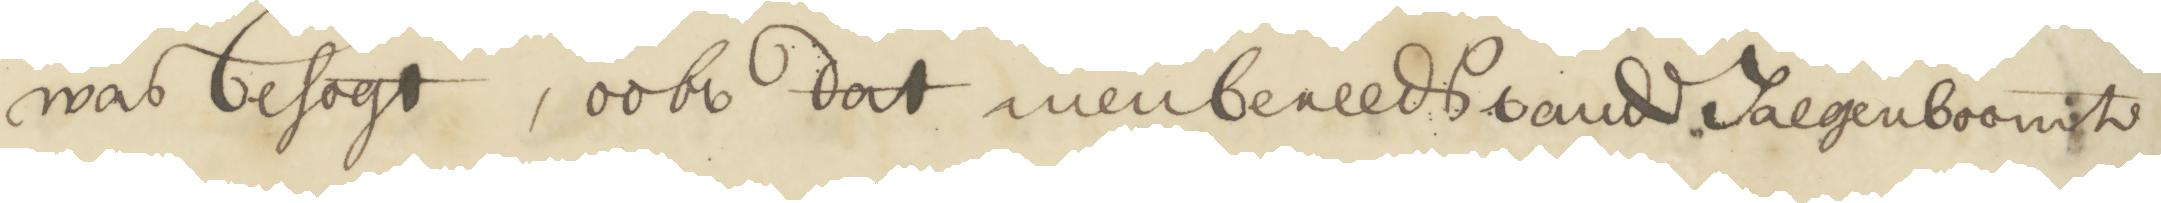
was besogt, ook dat men bereeds vande Iaegerboom te
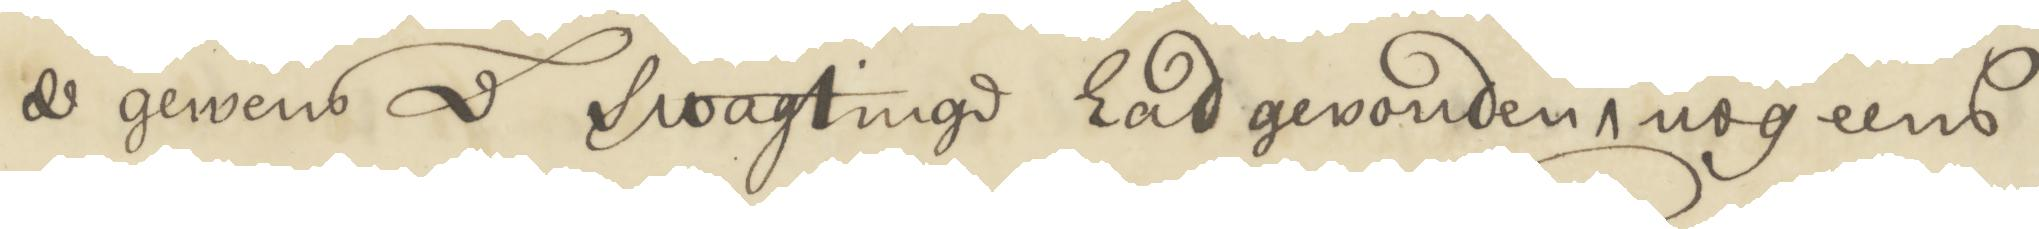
de gewenste verwagtinge had gevonden ^ nog eens
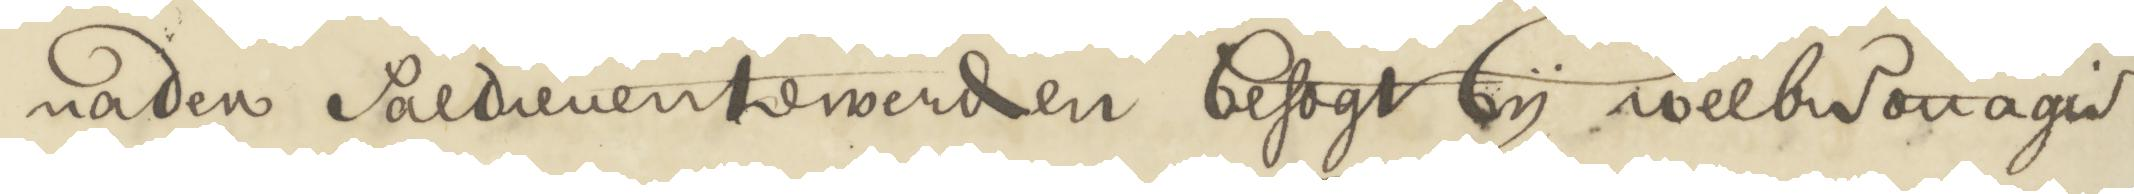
nader Sal dienen te werden besogt bij welke occagie
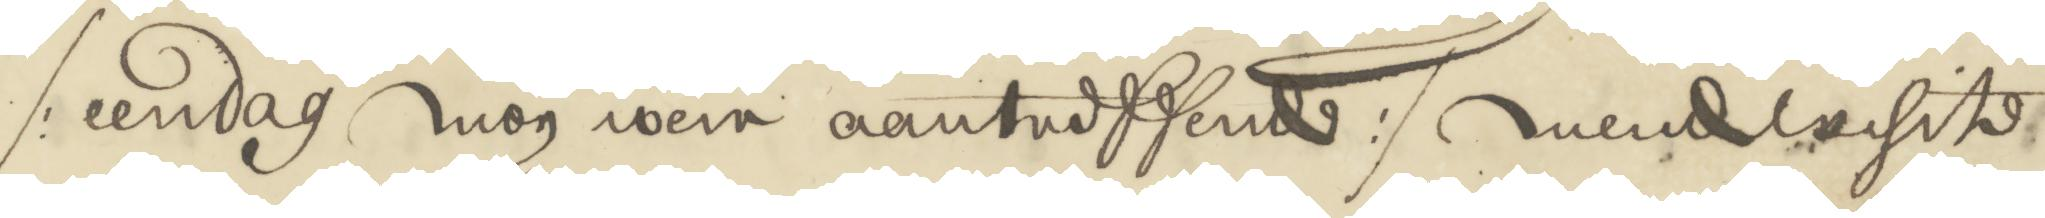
/:eendag moij weir aantreffende :/ men de visite
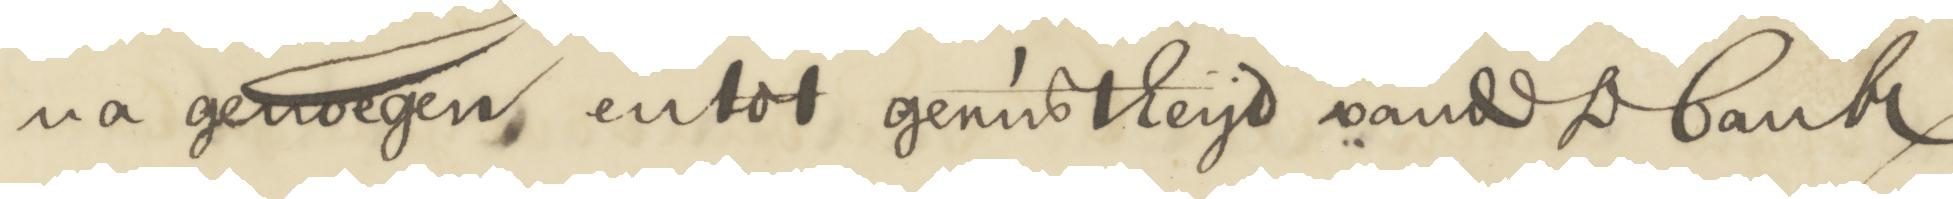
na genoegen, en tot gerustheijd vande te bank
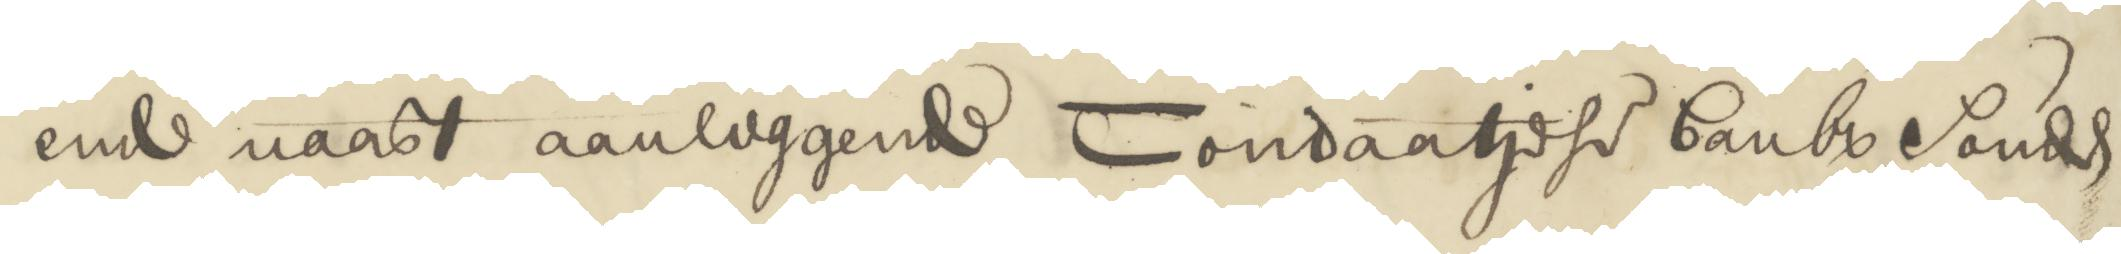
ende naast aanleggende Condaatjese bank souden
